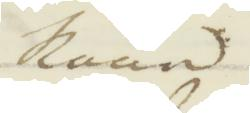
Kaan
